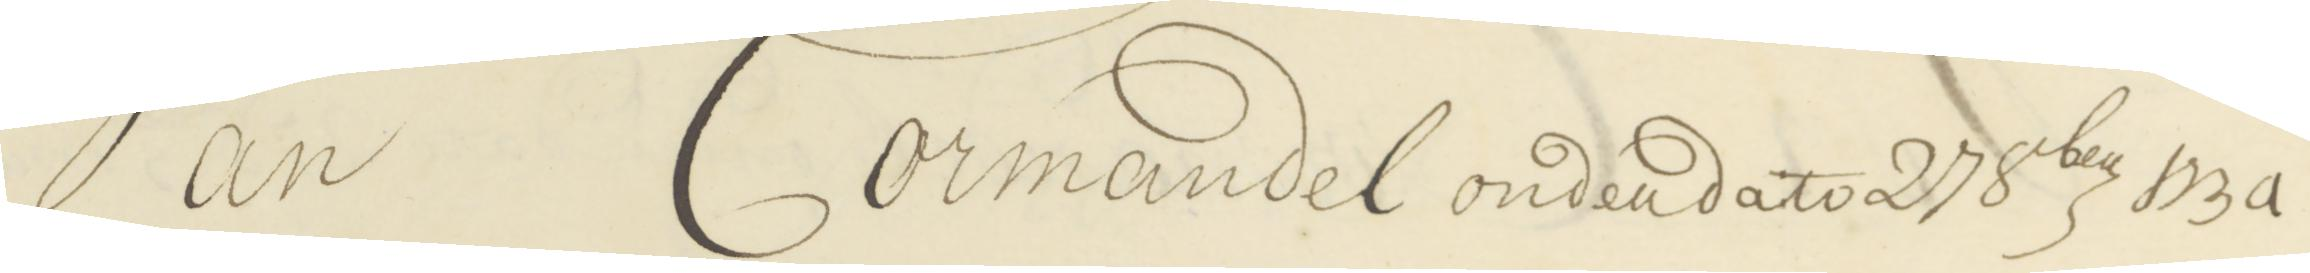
Van Cormandel onder dato 27 8ber 1734
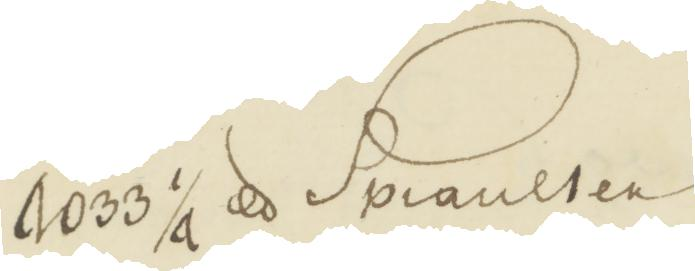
4033 1/4 lb Spiaulter
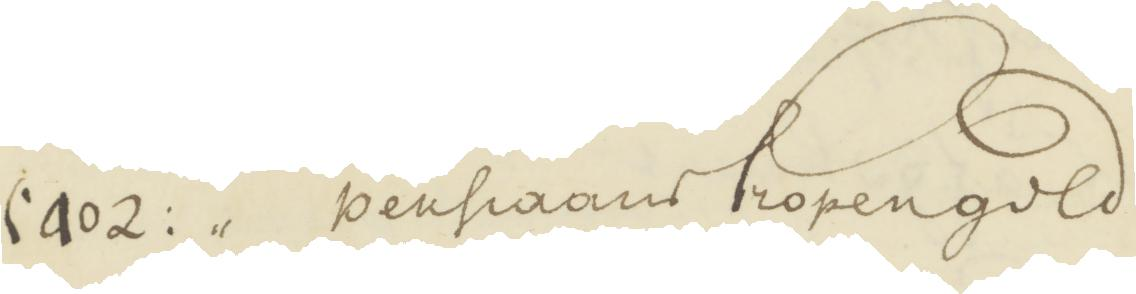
5402: „ persiaans kopergeld
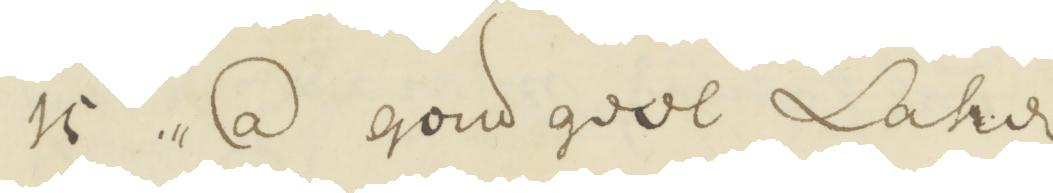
15 .„ @ goud geel Laken
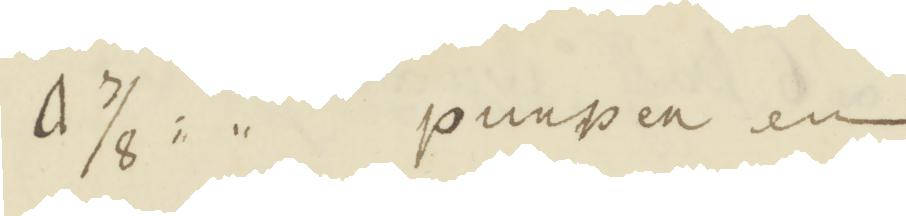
4 7/8: „ purper en
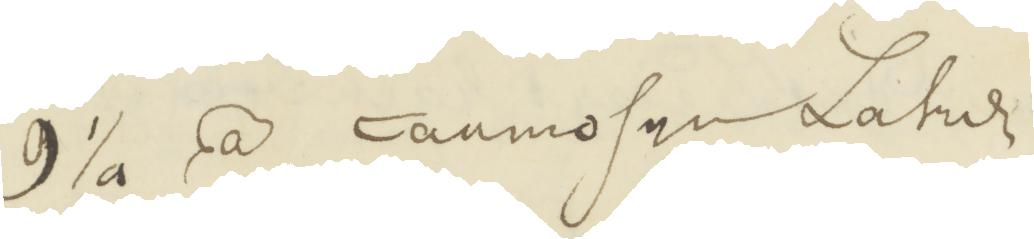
9¼ @ carmosyn Laken
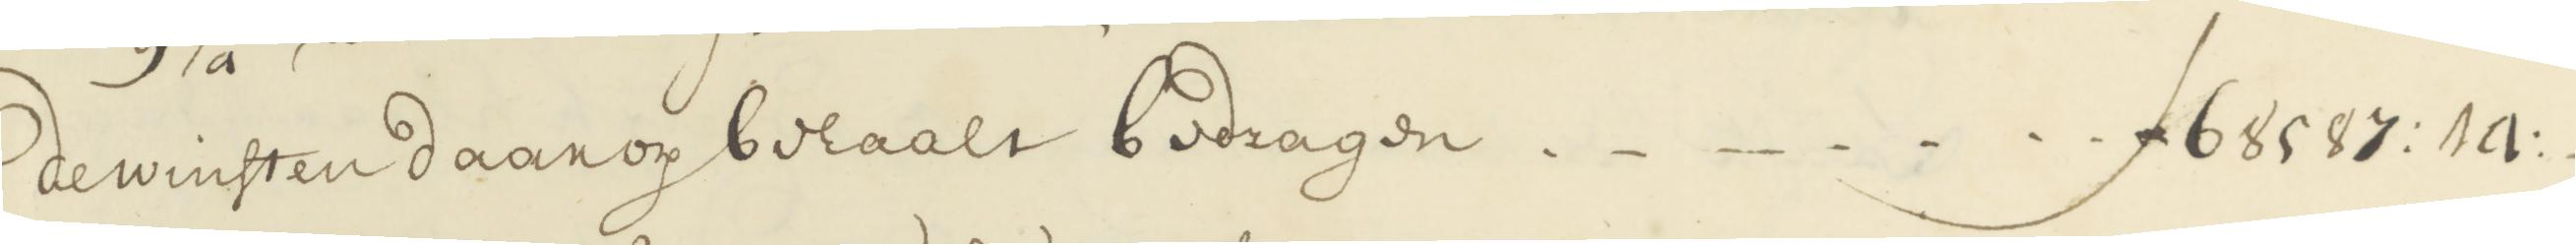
de winsten daar op behaalt bedragen . - - - - . .ƒ 68587: 14:
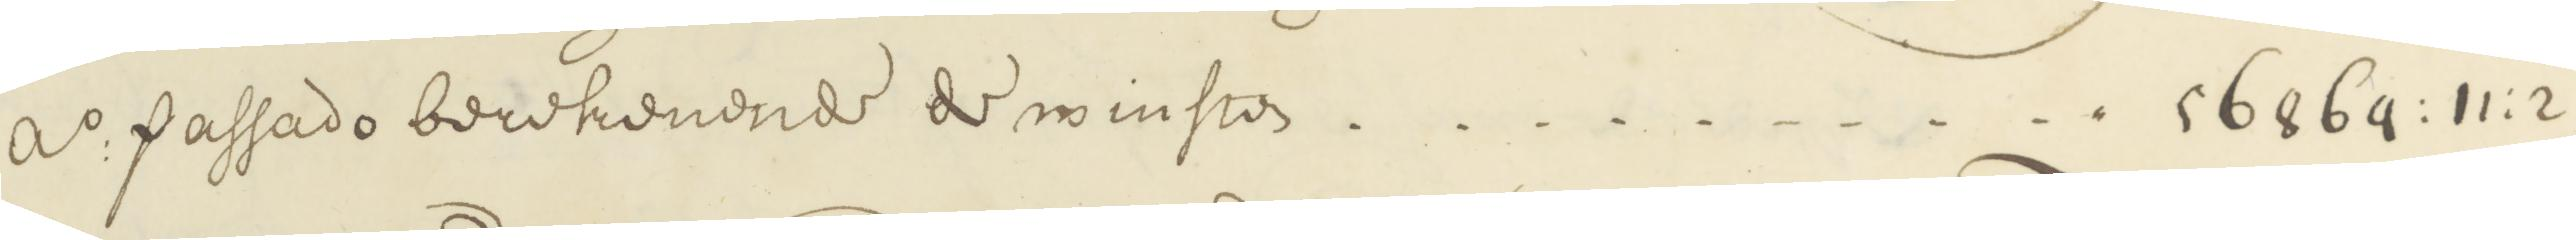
a:o passado berekenende de winsten . . . . . . . . . „ 56864: 11: 2
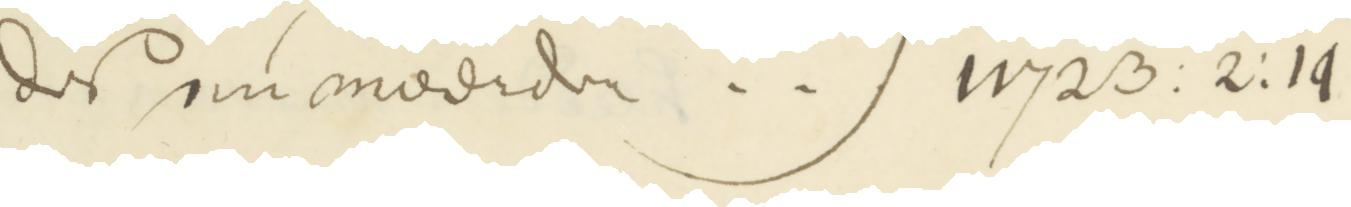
des nu meerder - - ƒ 11723: 2: 14
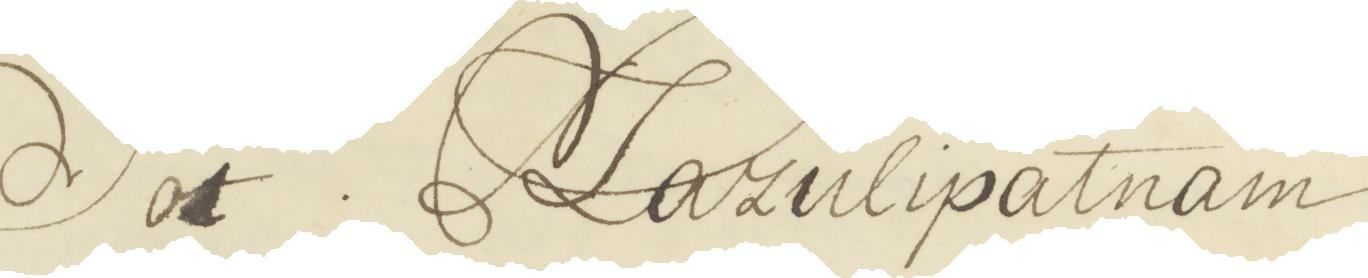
Tot Mazulipatnam
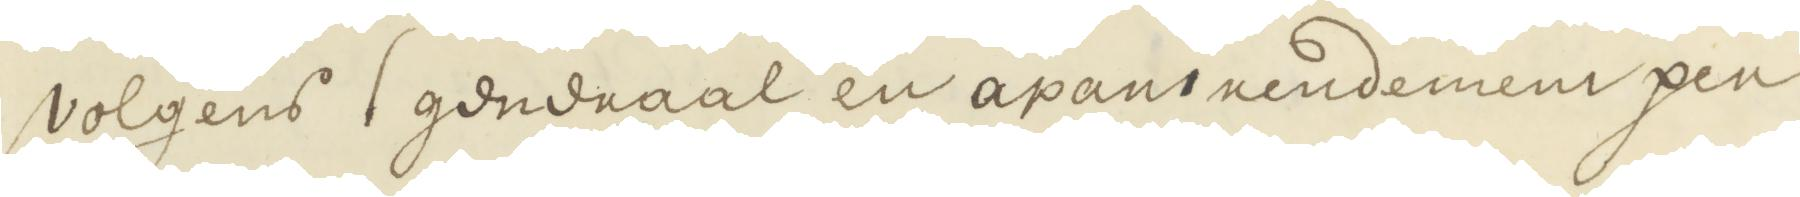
volgens t generaal en apart rendement per
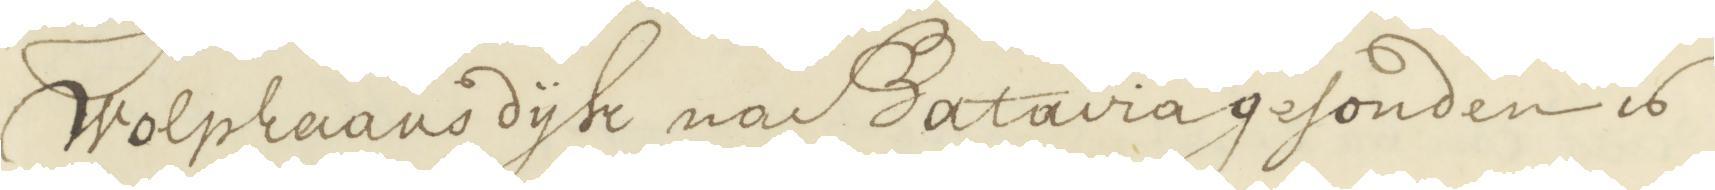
Wolphaarsdijk na Batavia gesonden is
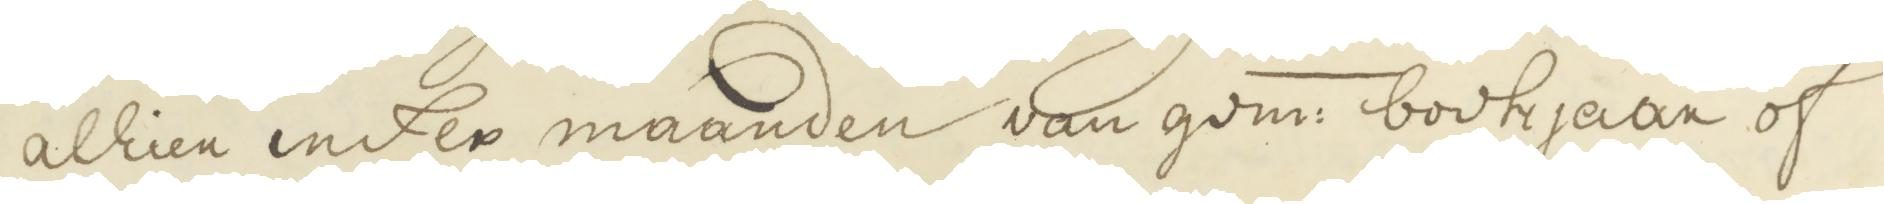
alhier in Eer maanden van gem: boekjaar of
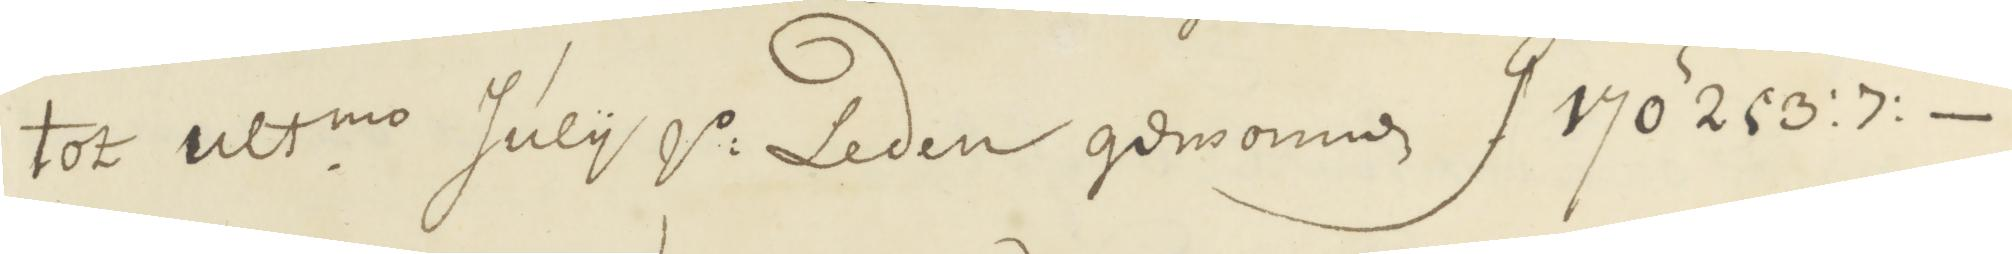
tot ult.mo Julij j:o Leden gewonnen ƒ 170'253: 7: —
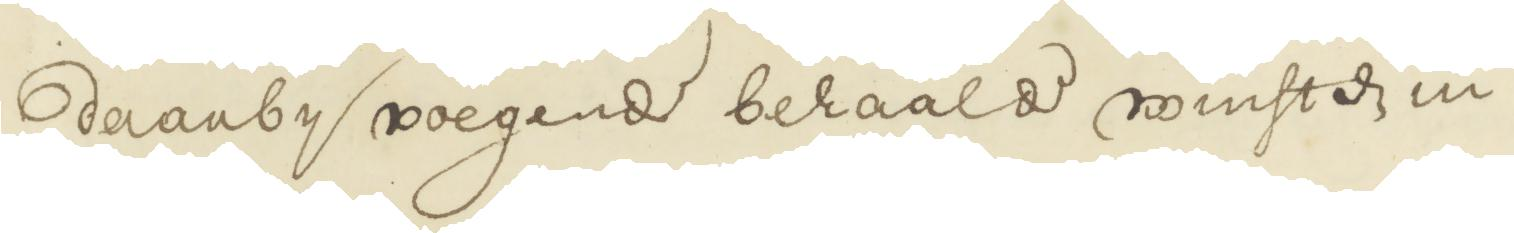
daarby voegende behaalde winsten in
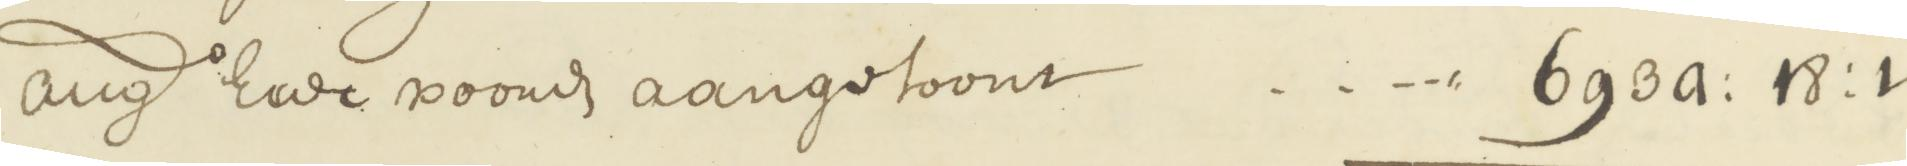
augo hier vooren aangetoont . . --„ 6934: 18: 1
